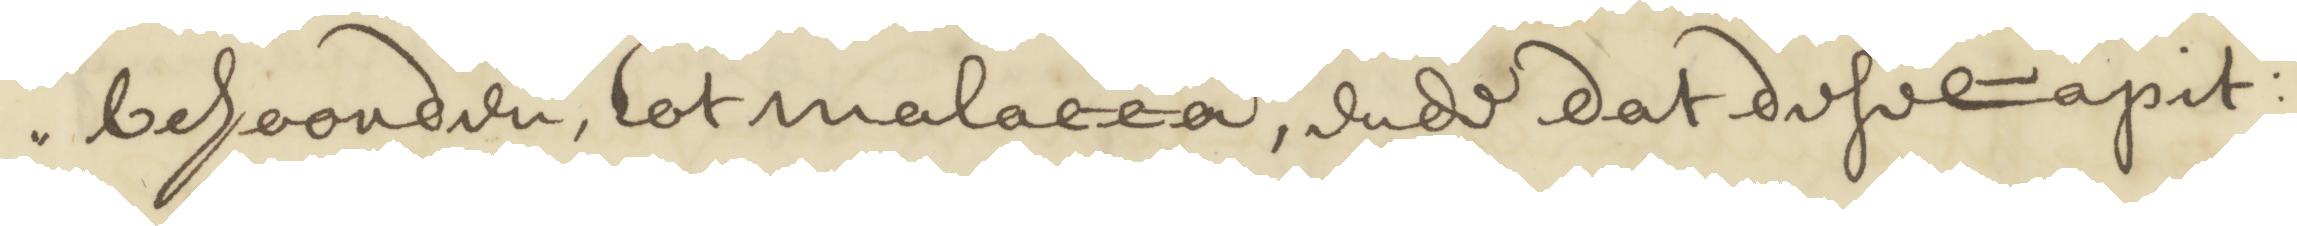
„behoorden, tot malacca, ende dat dese Capit:n
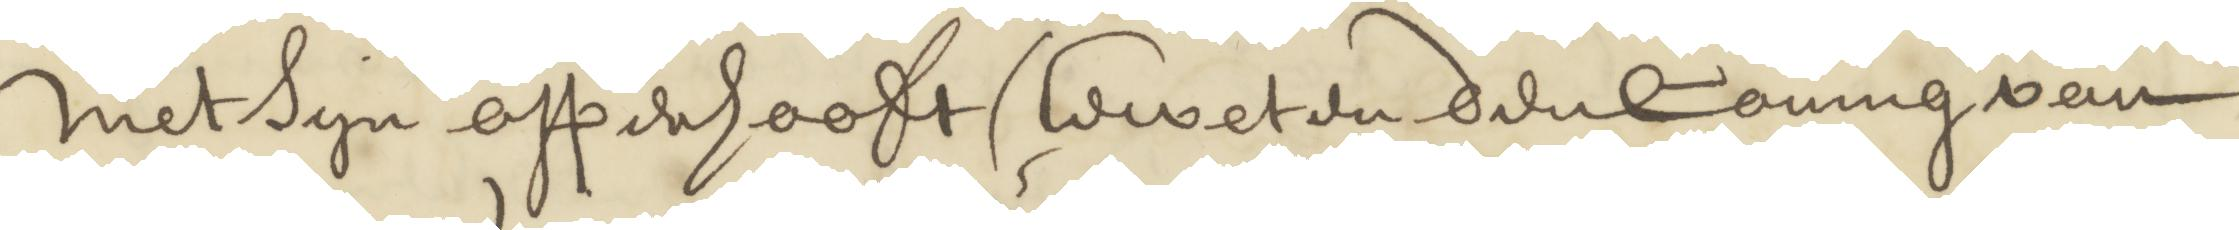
met sijn opperhooft (te weten den Coning van
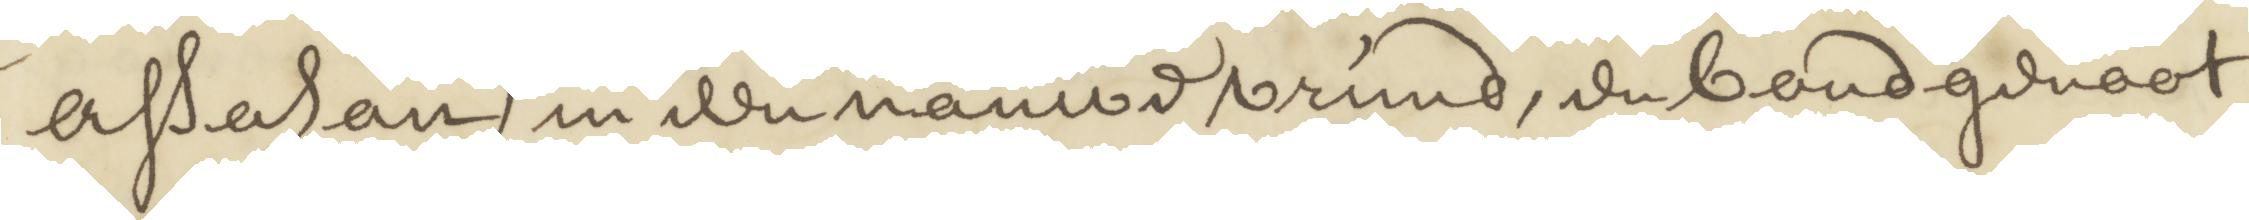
assahan) in een nauwe vrund, en bondgenoot
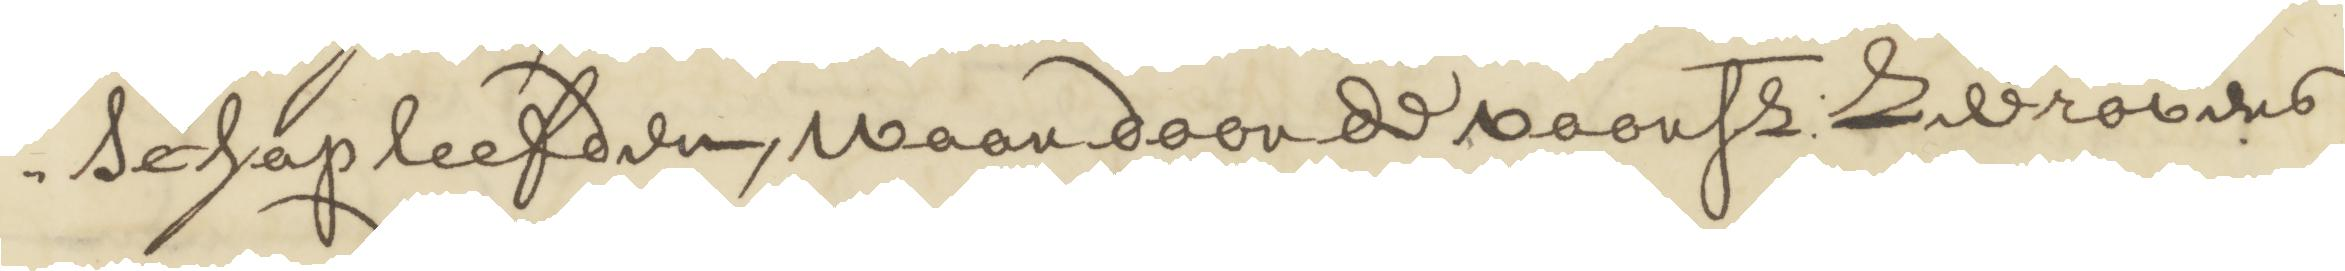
„schap leefden, waardoor de voorsz: zeerovers
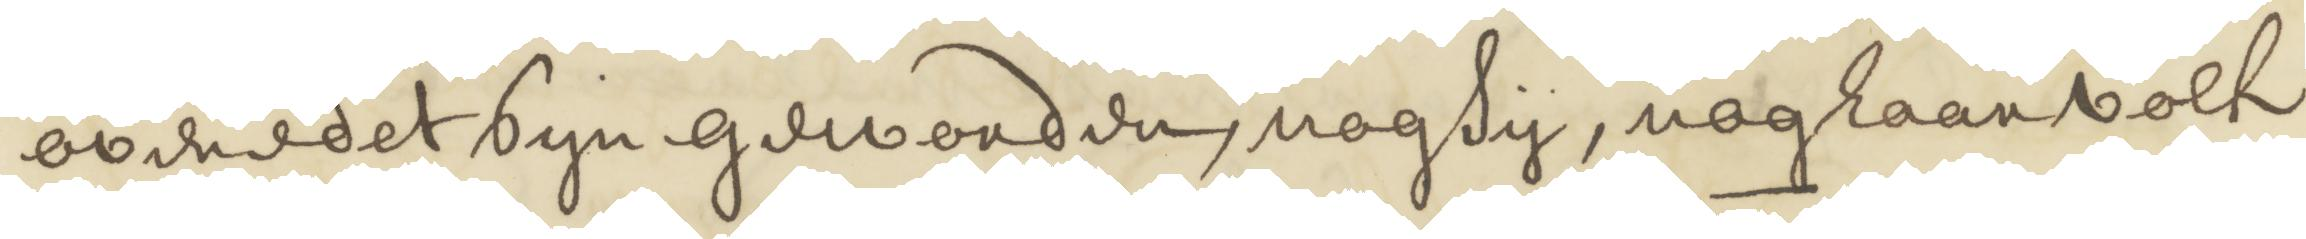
overedet sijn geworden, nog Sij, nog haar volk
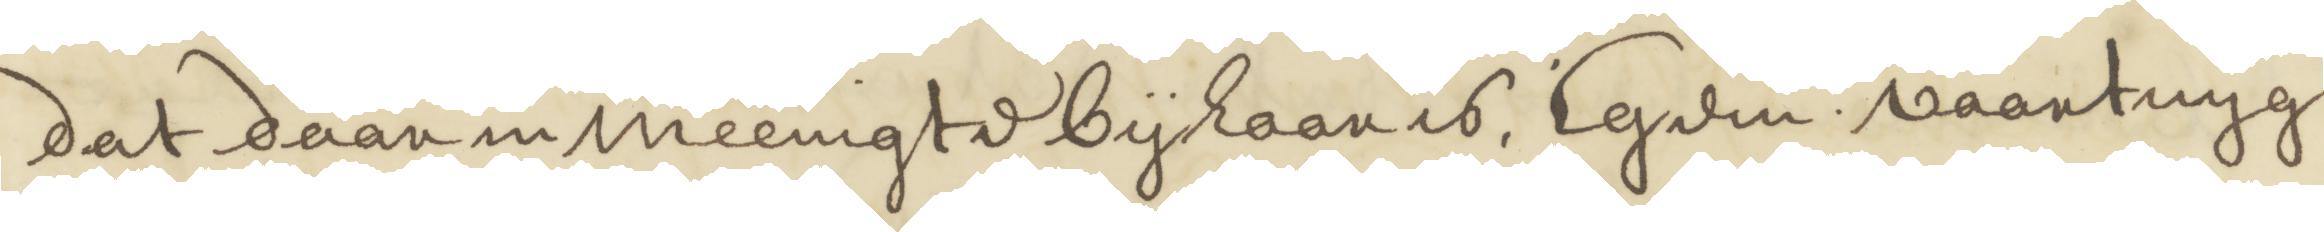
dat daar in meenigte bij haar is, 't gem: vaartuijg
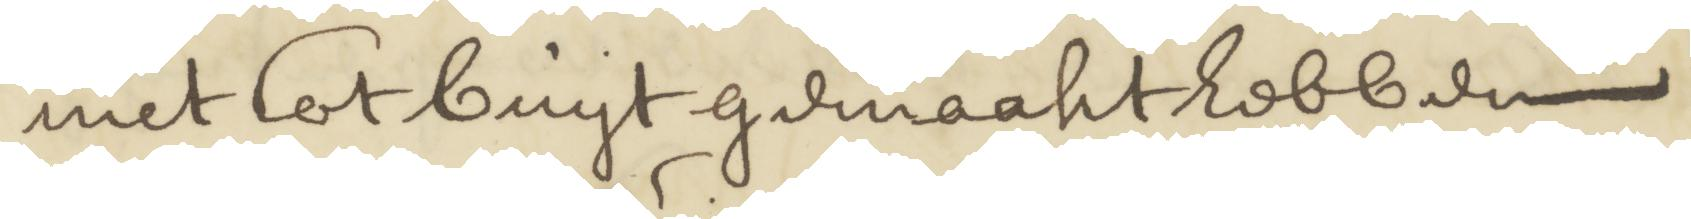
niet tot buijt gemaakt hebben
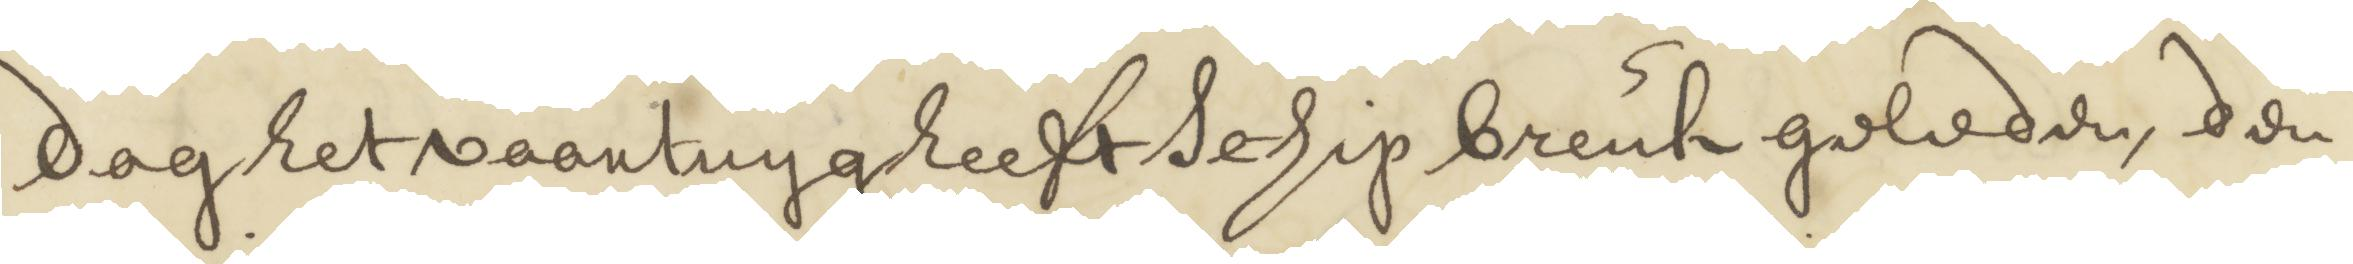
dog het vaartuijg heeft schip breuk geleden, den
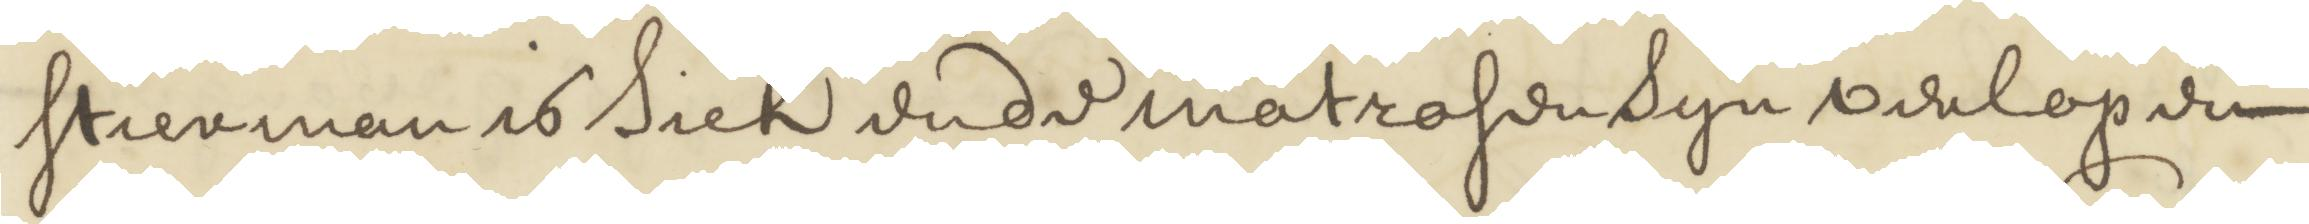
stierman is siek en de matrosen sijn verlopen
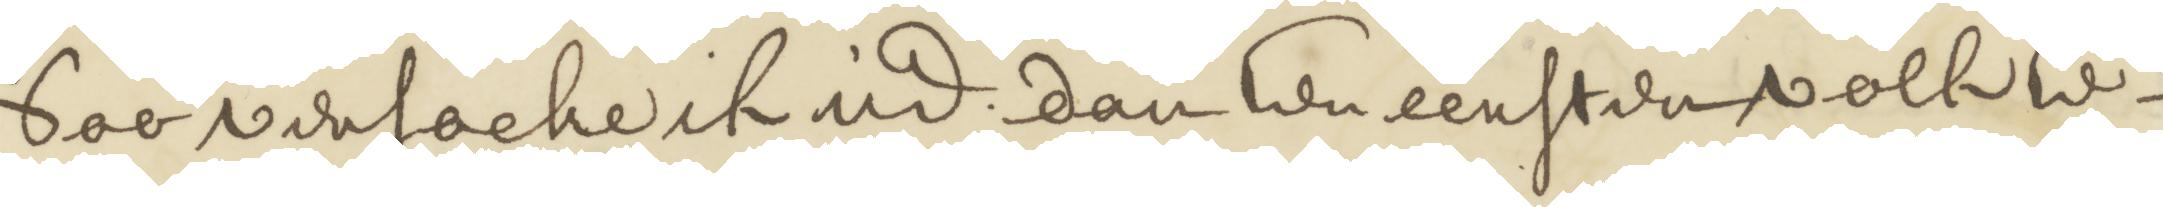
soo versoeke ik uE. dan ten eersten volk te —
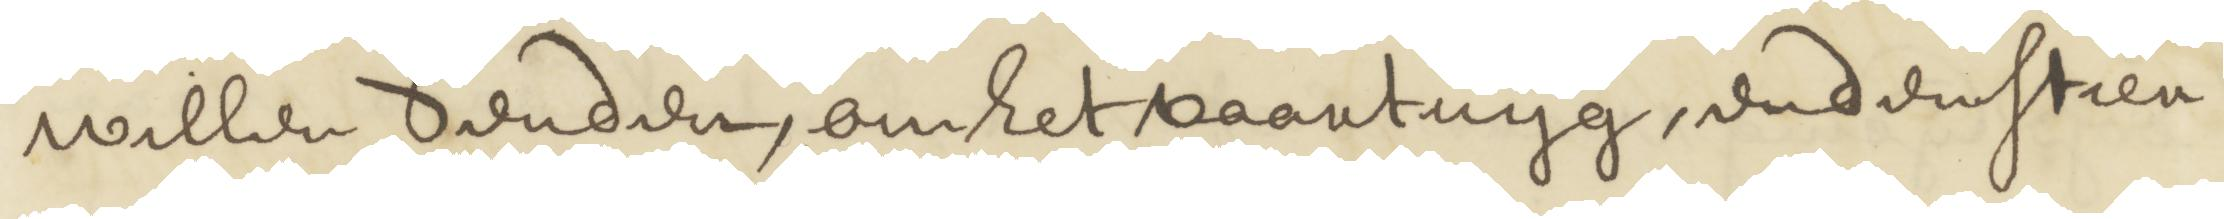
willen senden, om het vaartuijg, en den stier
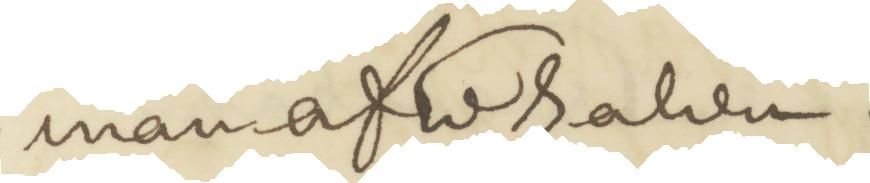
man af te halen
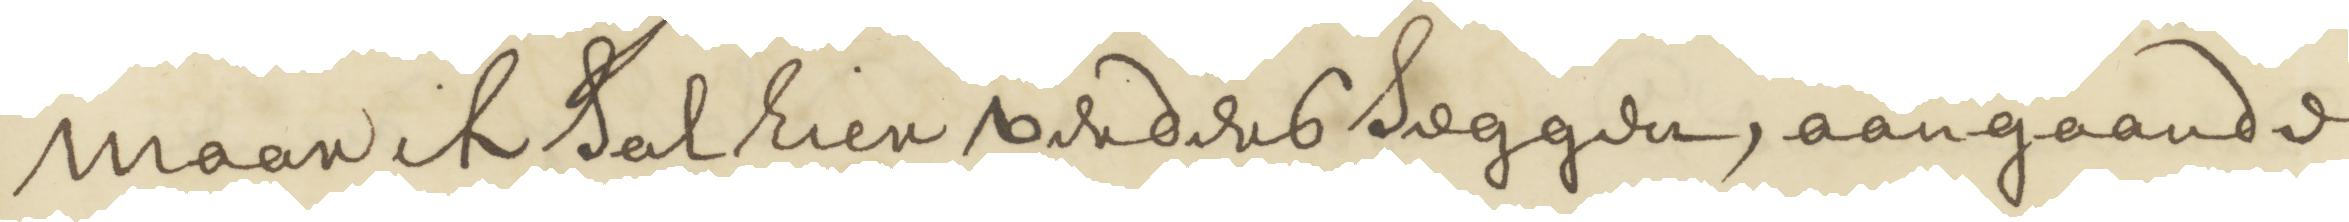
maar ik sal hier verders seggen, aangaande
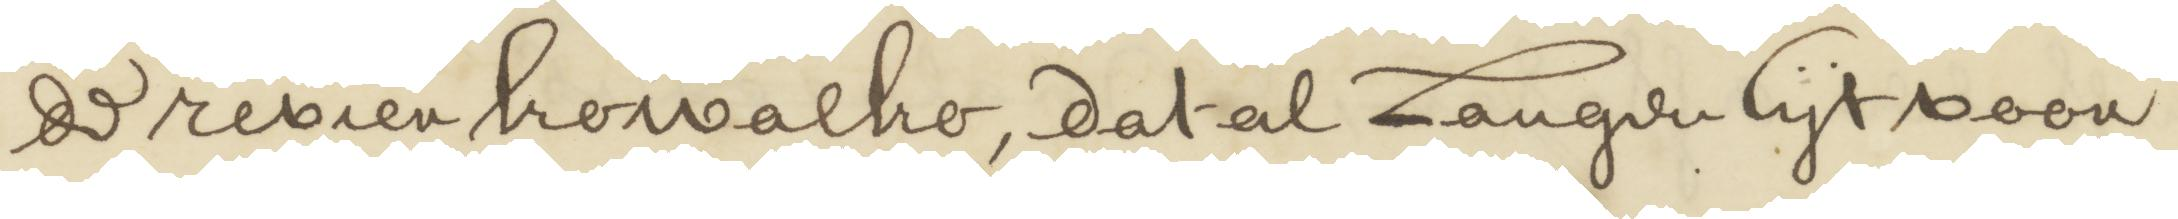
de revier kowalko, dat al langen tijt voor
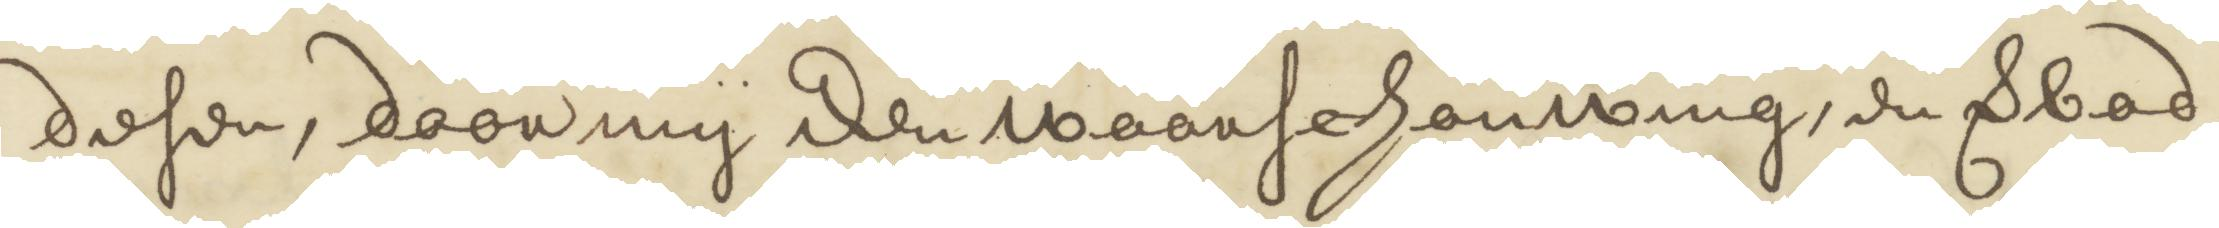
desen, door mij Een waarschouwing, en verbod
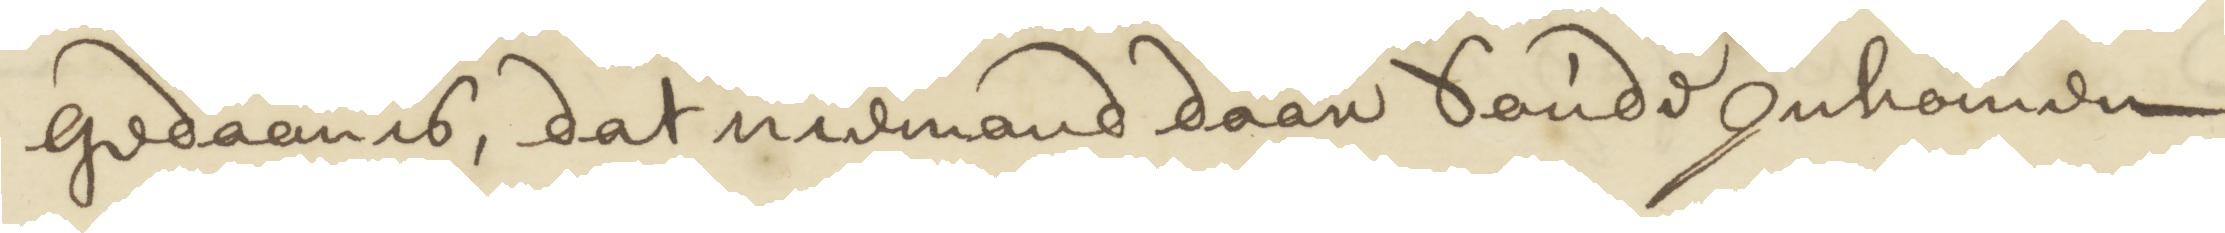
gedaan is, dat niemand daar soude jnkomen,
